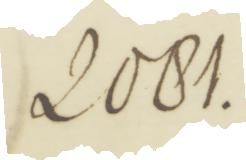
2081.
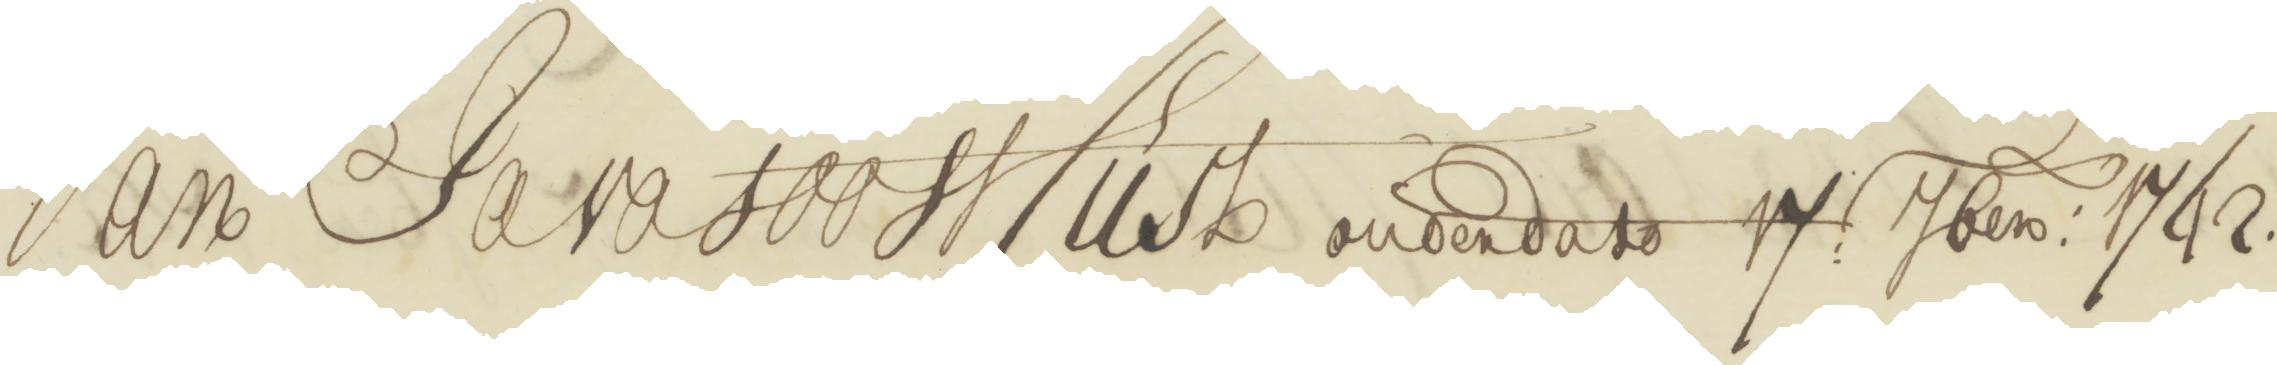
Van Iavasoost Cust onderdato 17:' 7ber: 1742.
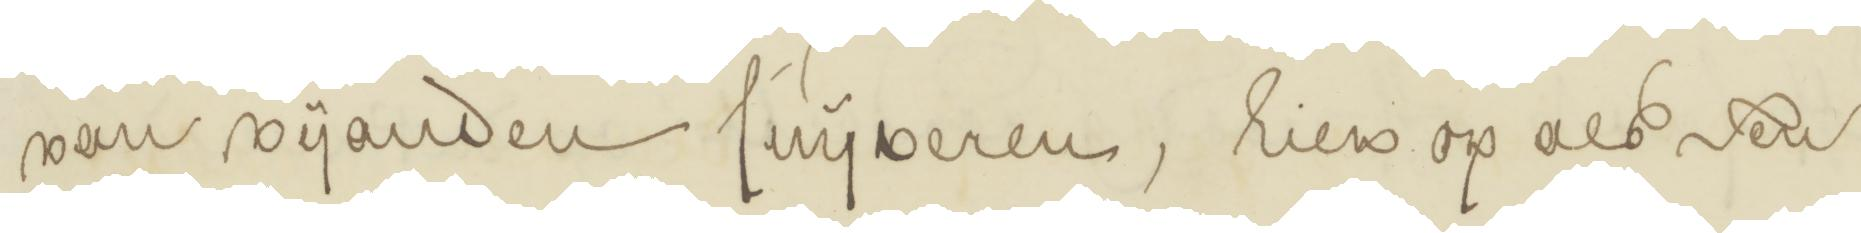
van vijanden suijveren, hier op als Een
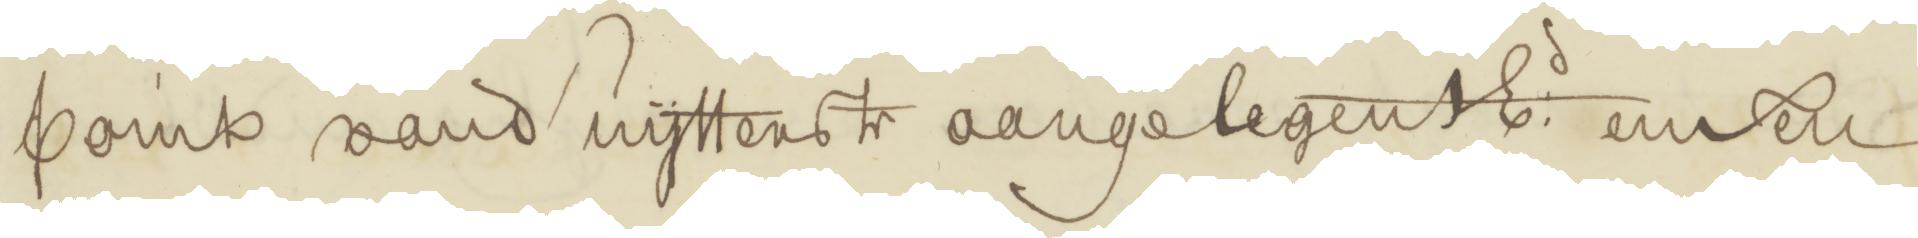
point van d’ uijtterste aangelegenth:d en Een
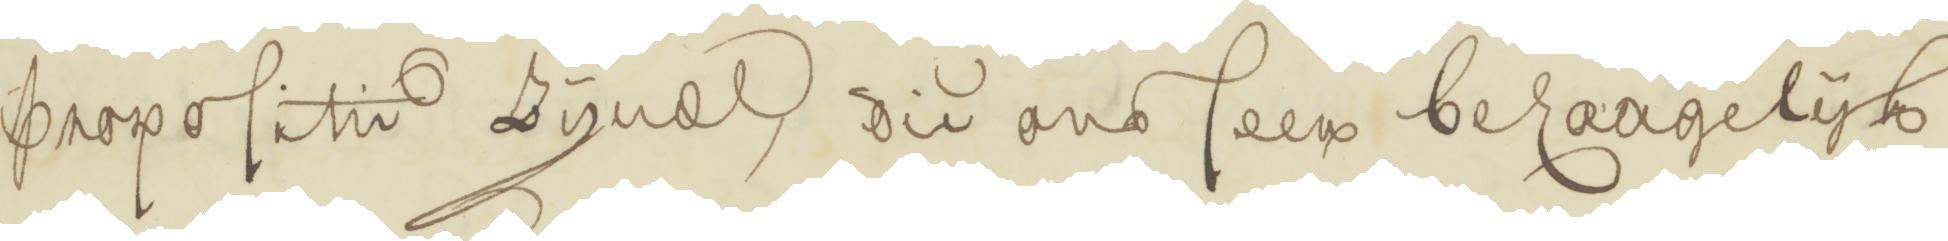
propositie zijnde, die ons seer behaagelijk
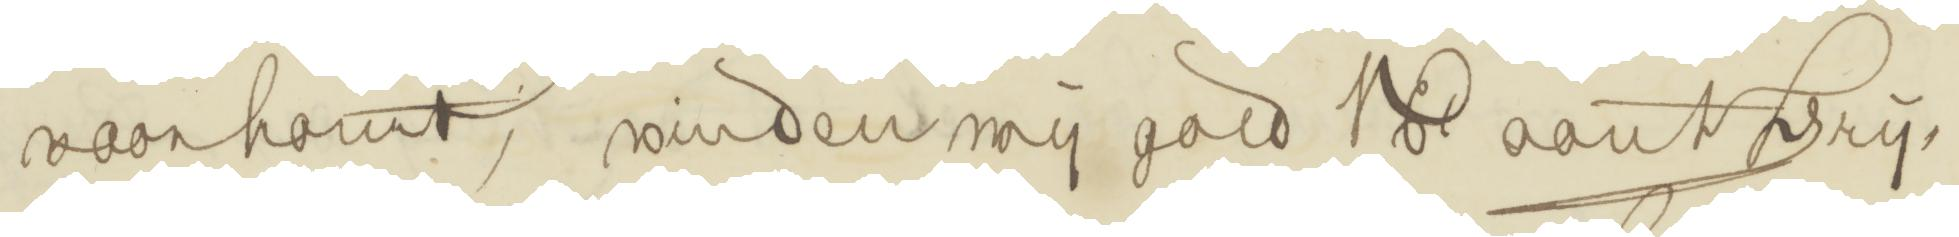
voorkomt, vinden wij goed VE aan te schrij„
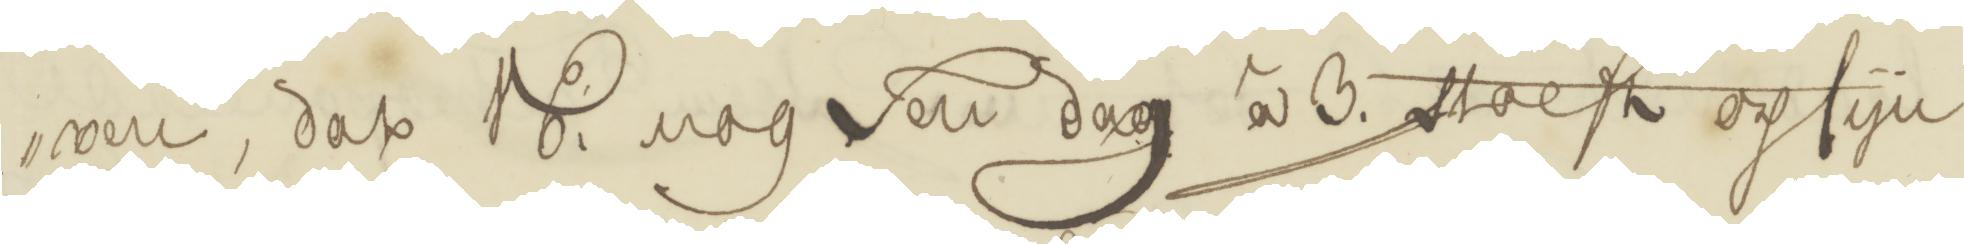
„ven, dat VE: nog Een dag â 3. vertoeft op sijn
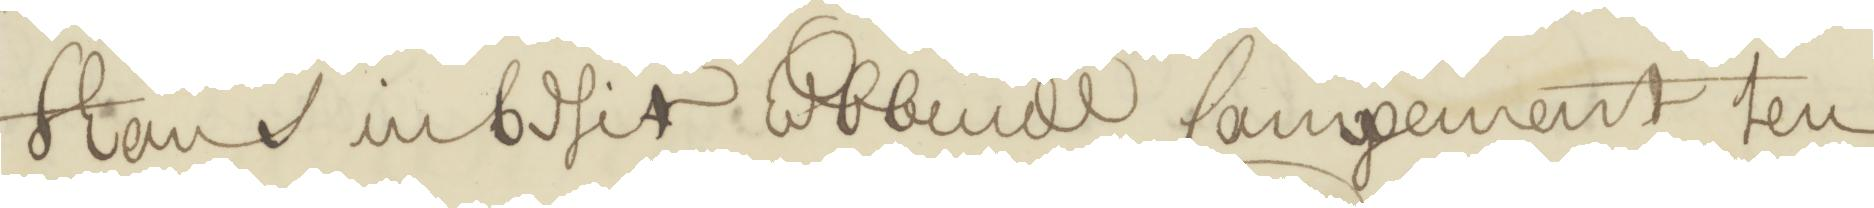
thans in besit hebbende Campement ten
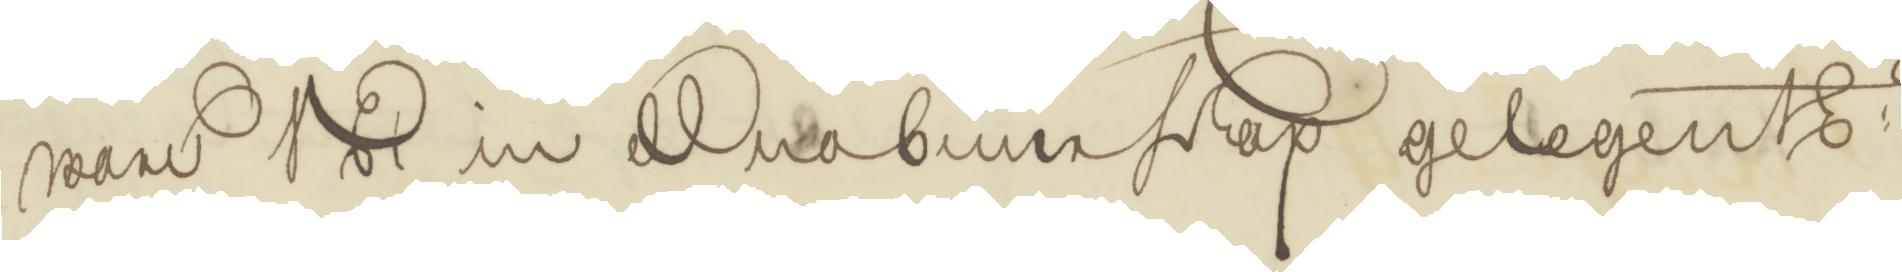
ware VE: in de nabuurschap gelegenth:d
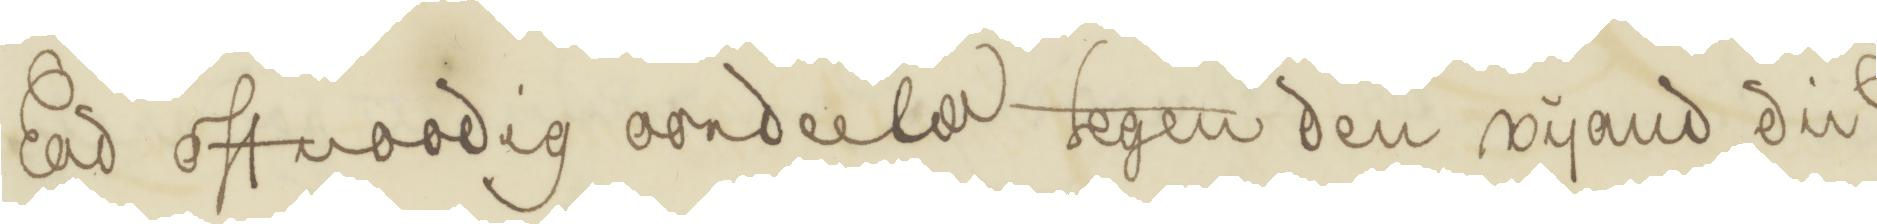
had off noodig oordeelde tegen den vijand die
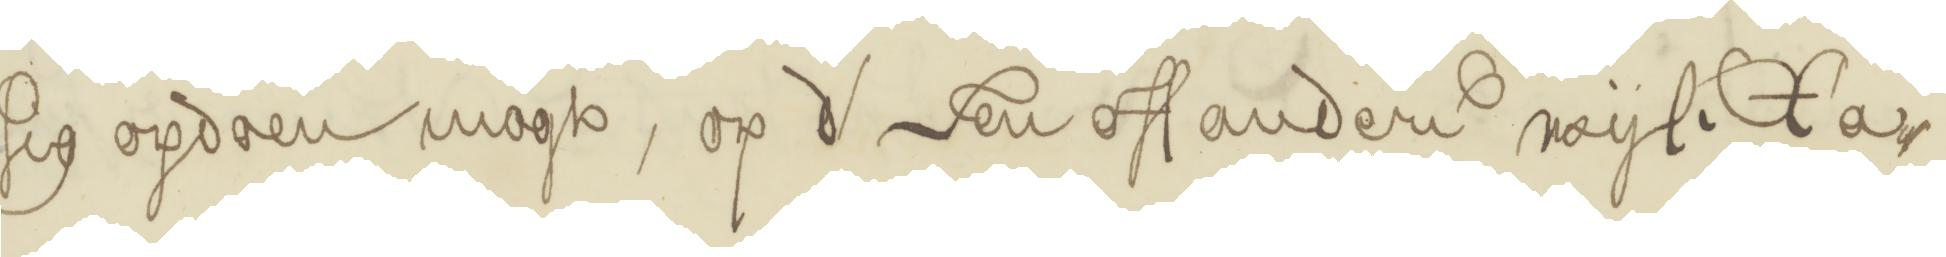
sig opdoen mogte, op d’ Een off andere wijle Xa„
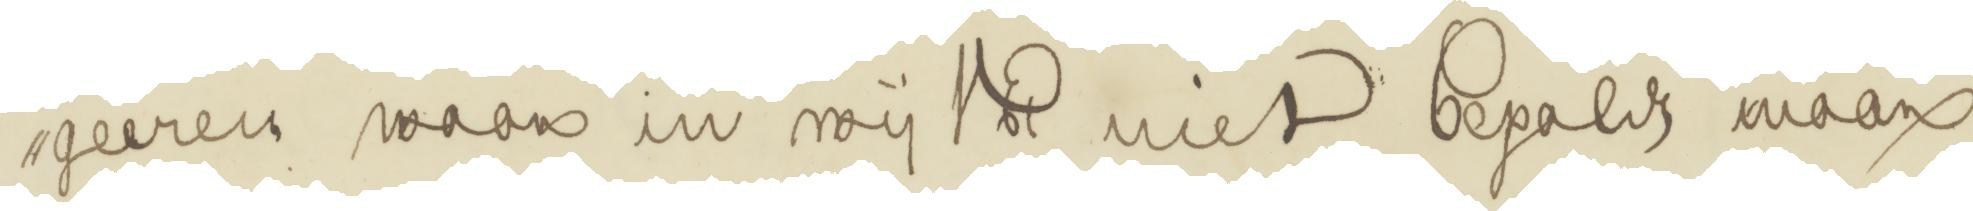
„geeren waar in wij VE: niet bepalen maar
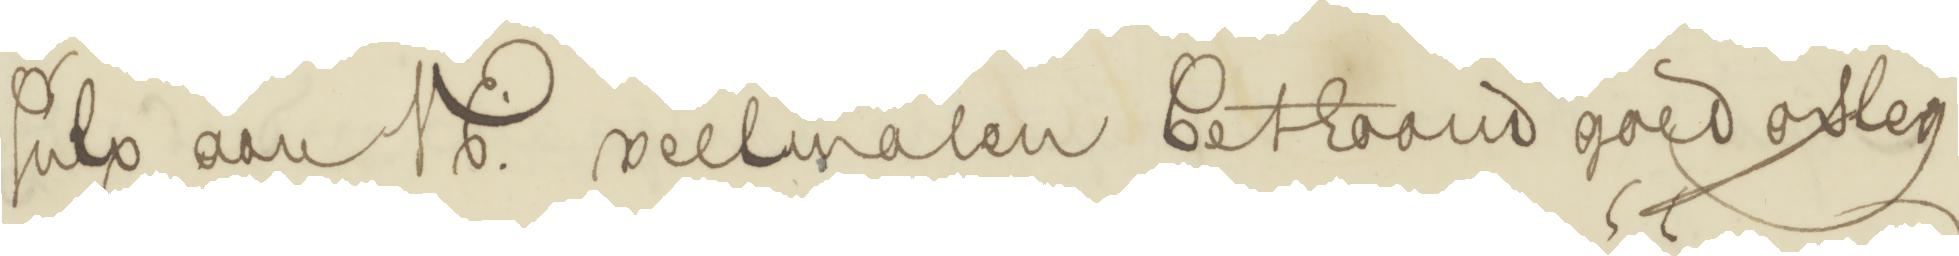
sulx aan VE: veelmalen bethoond goed overleg
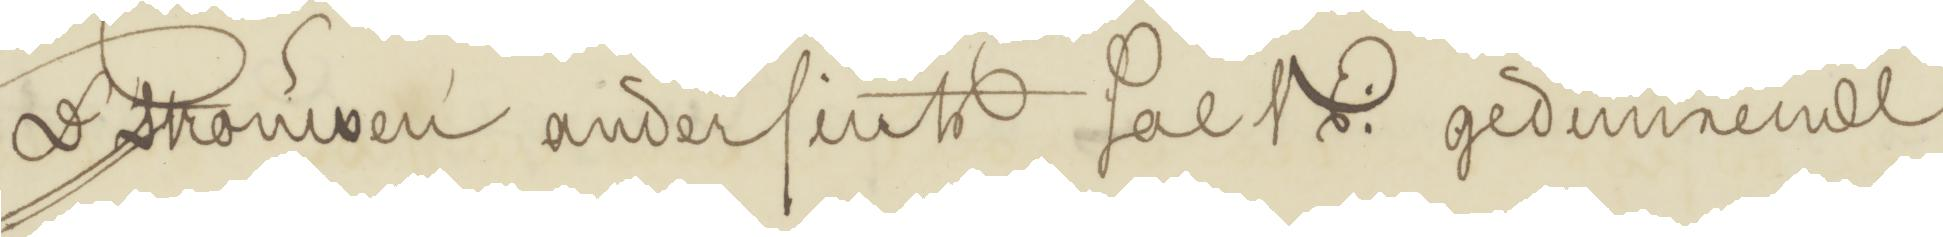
te vertrouwen andersints sal VE: geduurende
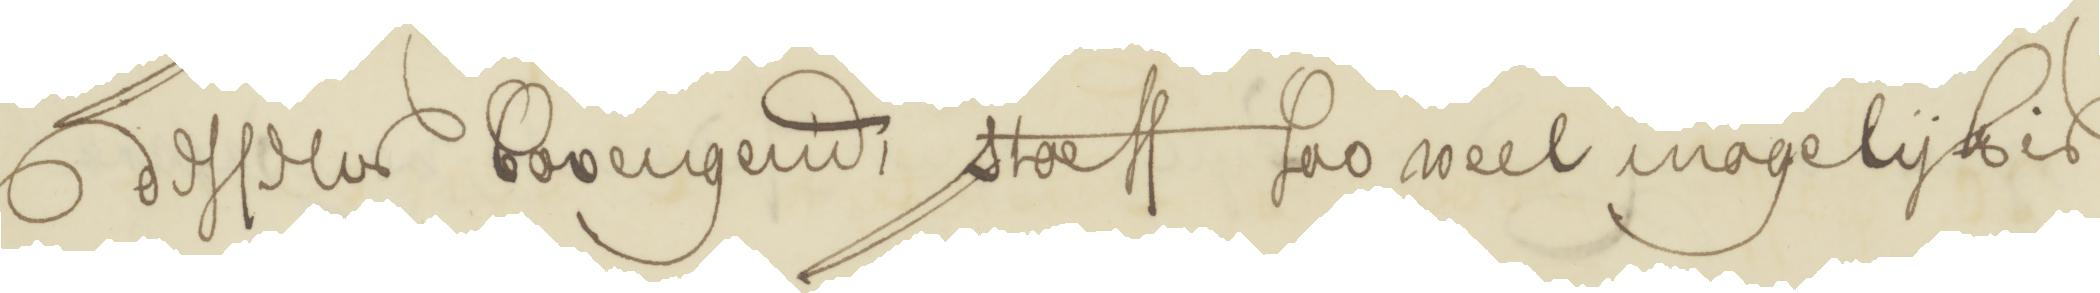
desselve bovengem: vertoeff soo veel mogelijk is
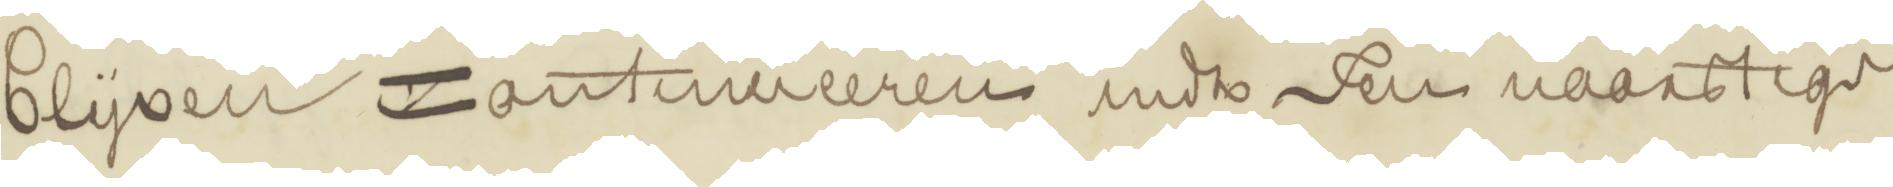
blijven continueeren met Een naarstige
